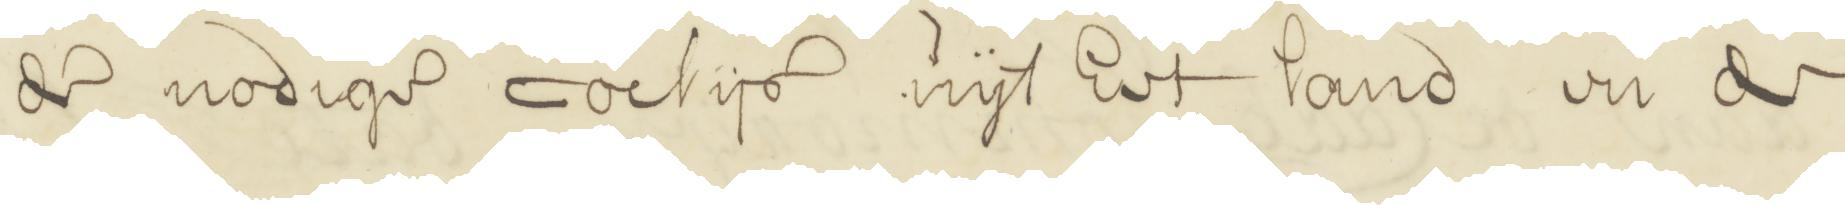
de nodige coelijs uijt het land en de
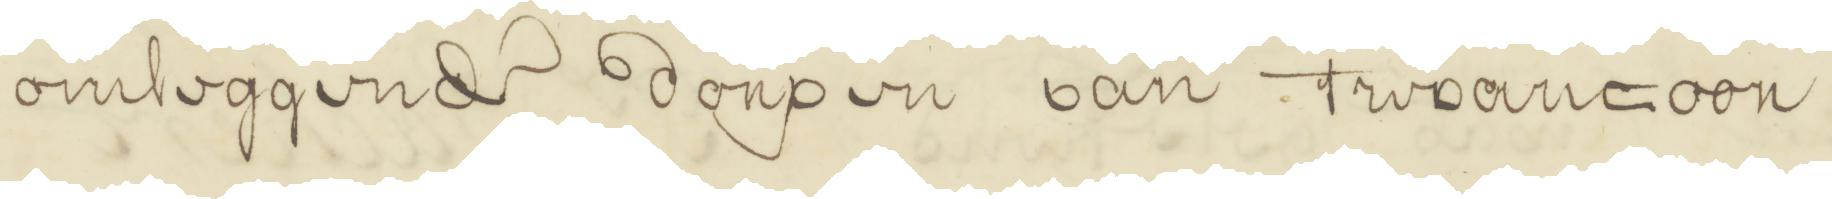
omleggende dorpen van trevancoor
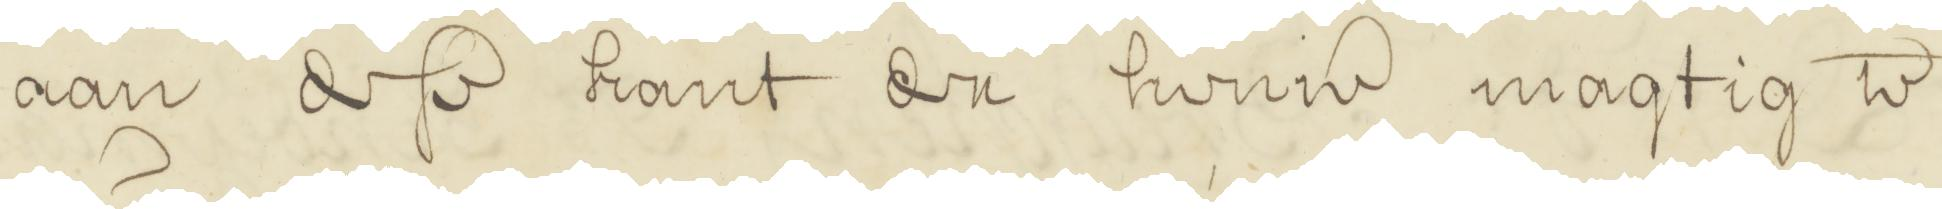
aan dese kant der lienie magtig te
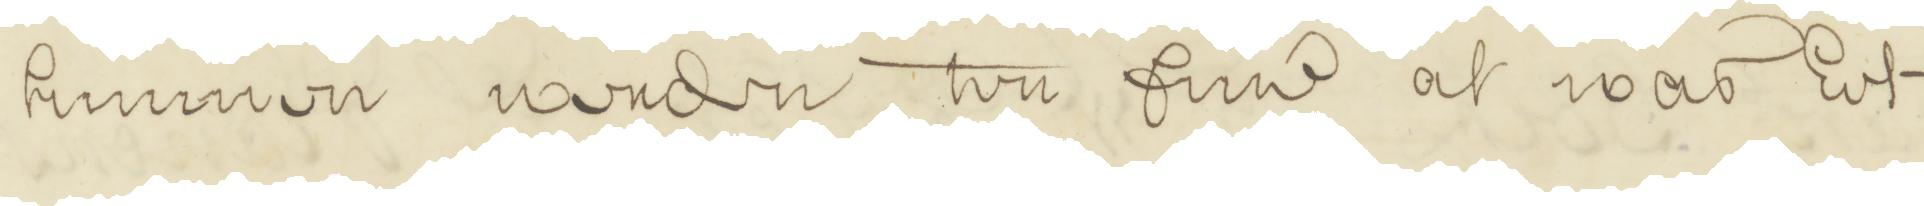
kunnen werden ten fine al was het
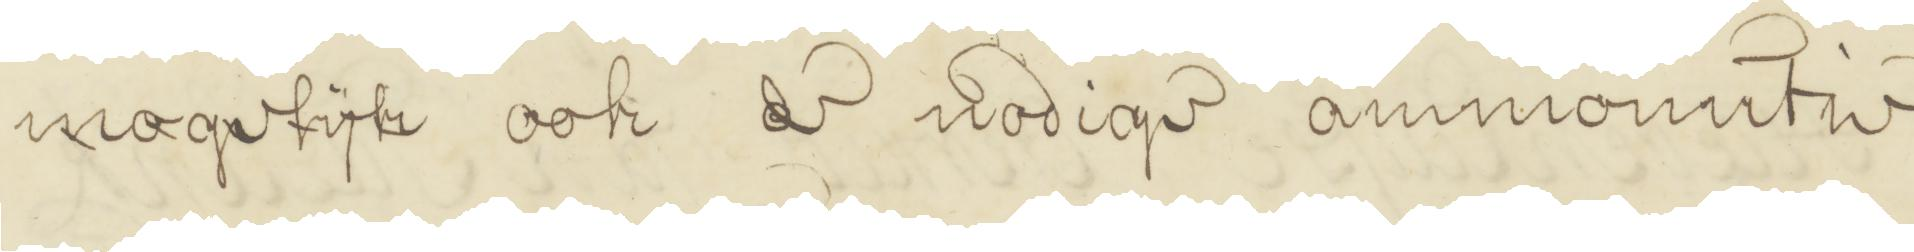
mogelijk ook de nodige ammonutie
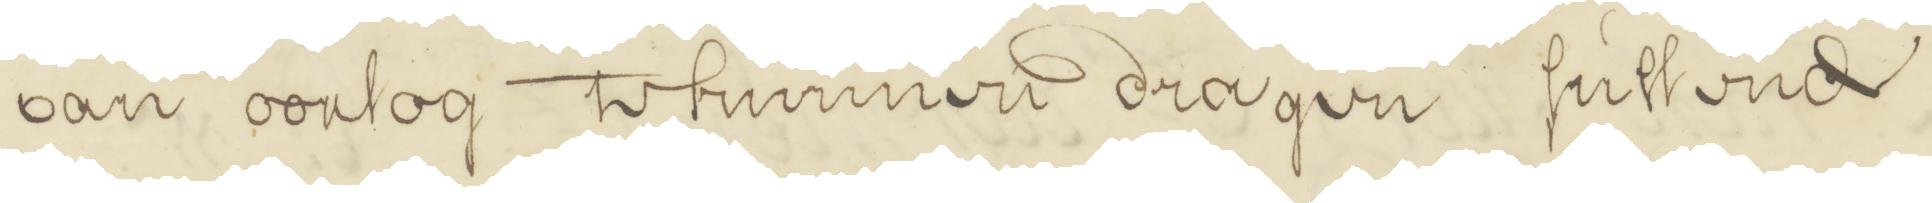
van oorlog tekunnen dragen sullende
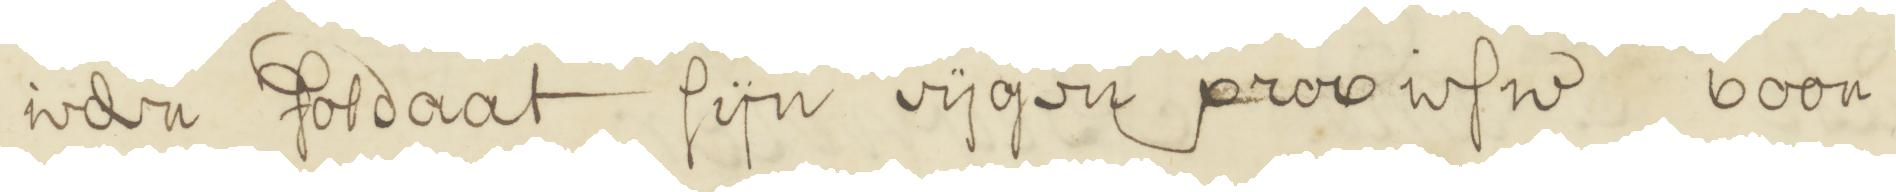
ieder soldaat sijn eijgen proviesie voor
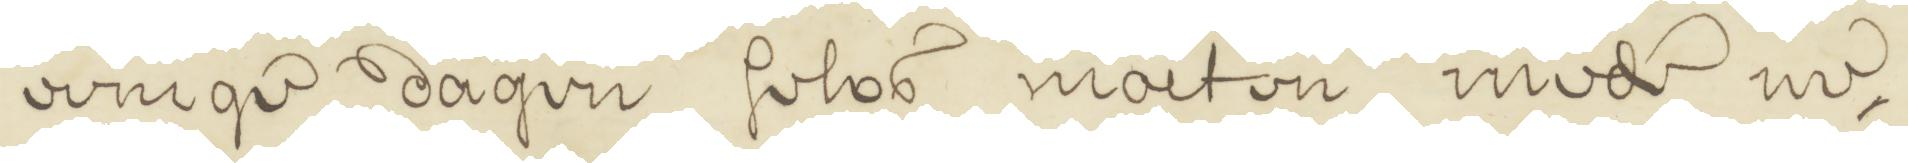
eenige dagen selvs moeten mede ne„
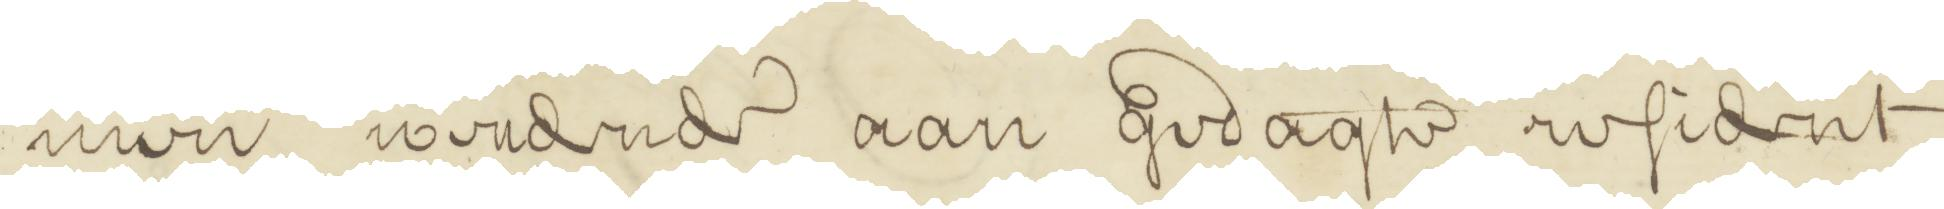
men werdende aan gedagte resident
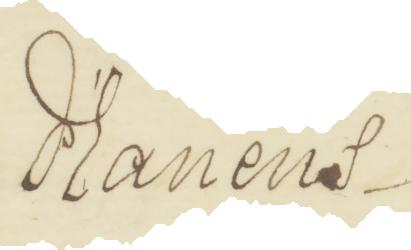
d'hanens-
